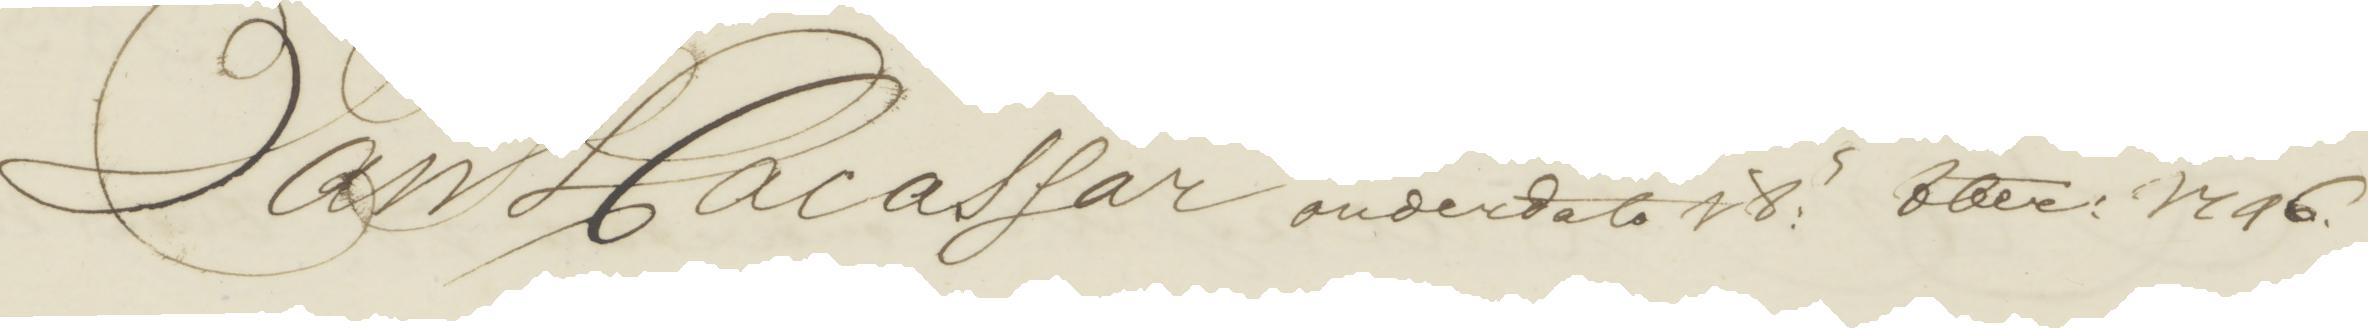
Van Macassar onderdato 18:' 8ber: 1746.
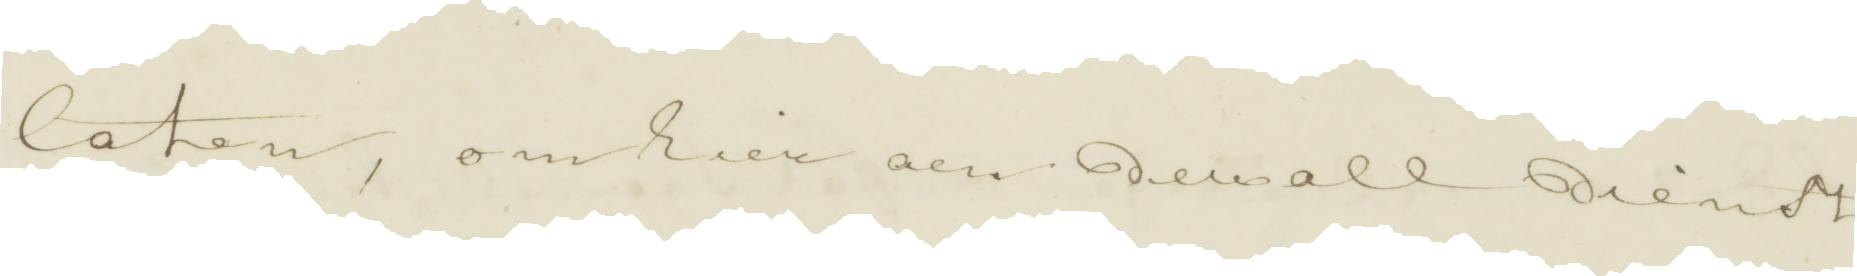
laten, om hier aen dewall dienst
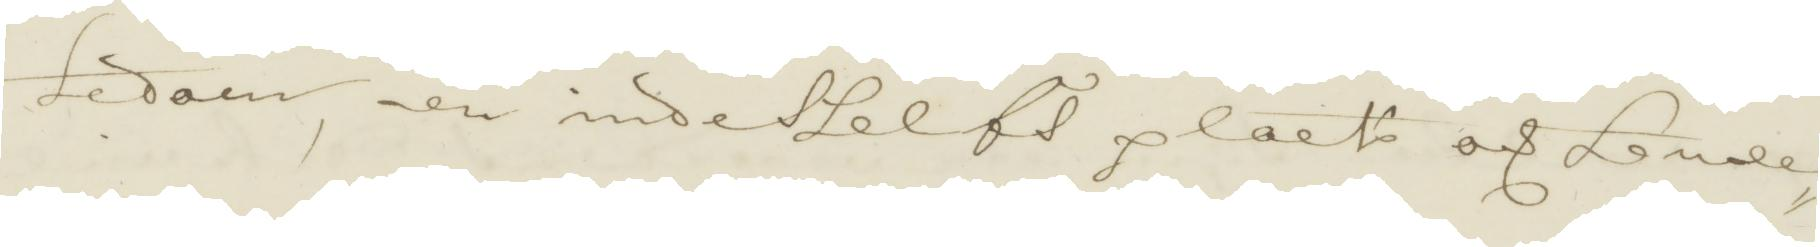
te doen, en indesselfs plaets over te nee„
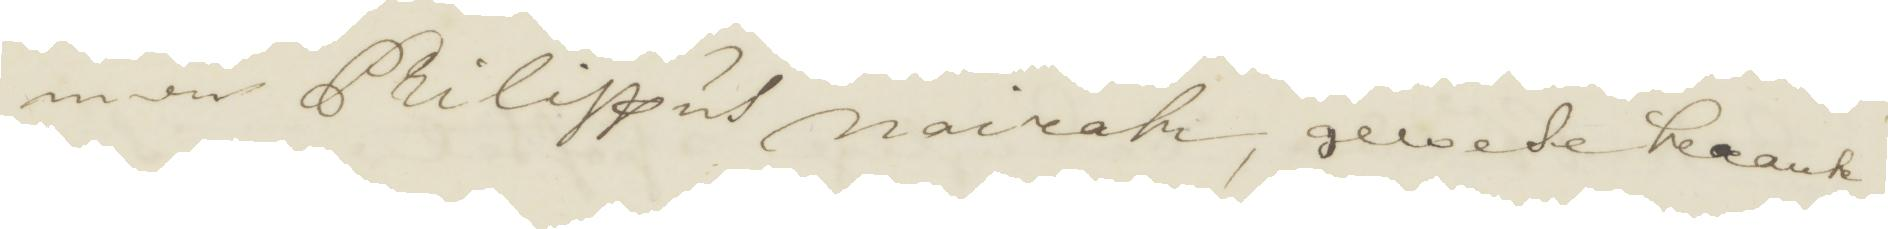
men Philippus nairak, gewese krank
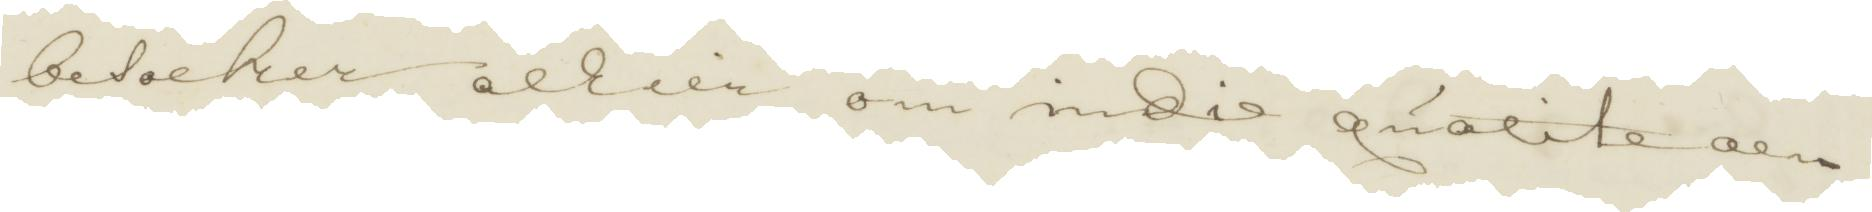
besoeker alhier om in die qualite aen
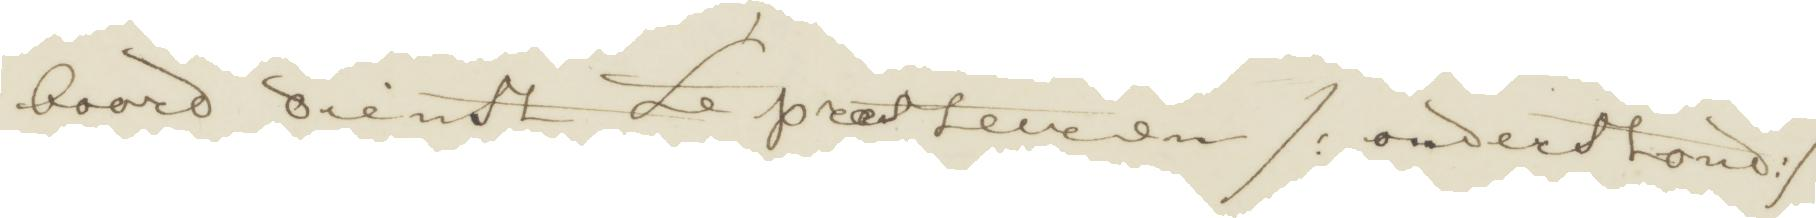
boord dienst te presteeren /: onderstond:/
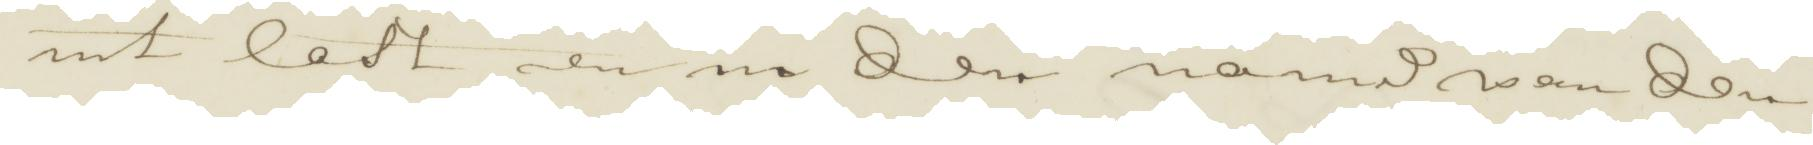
uit last en in den name van den
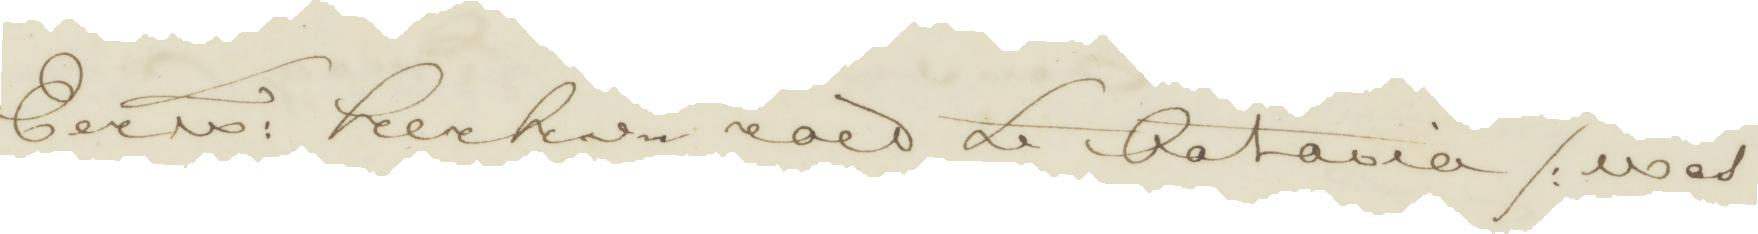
Eerw: kerken raed te batavia /: wes
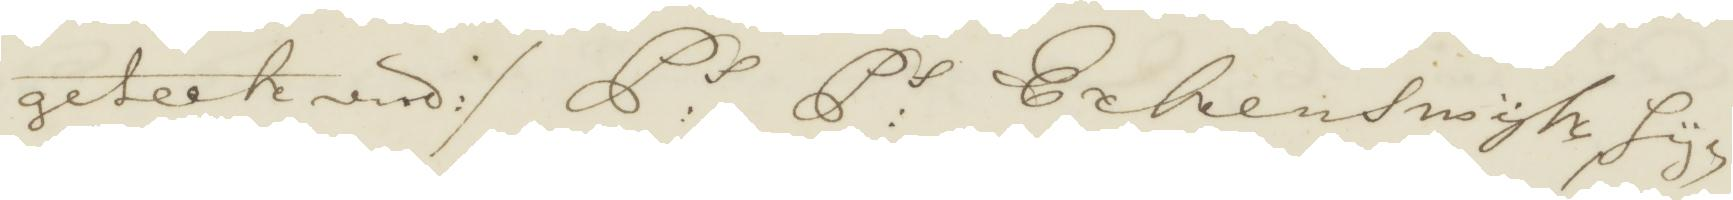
geteekend:/ P:s P:s Erkenswijk, sijn
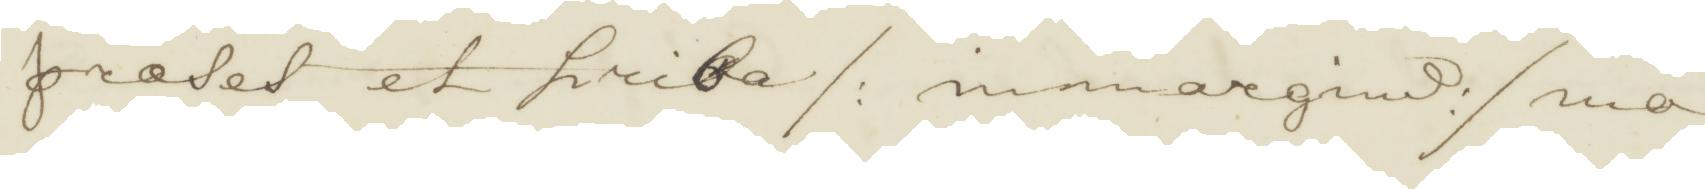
prases et scriba /: in margine: / ma
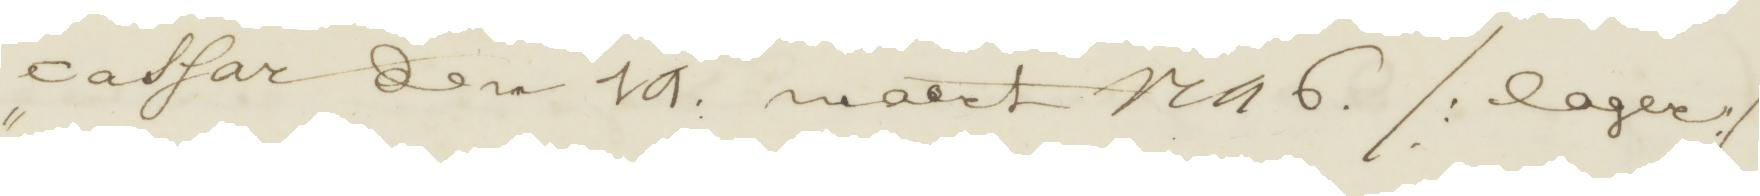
„cassar den 14.' maert 1746. /: lager:/
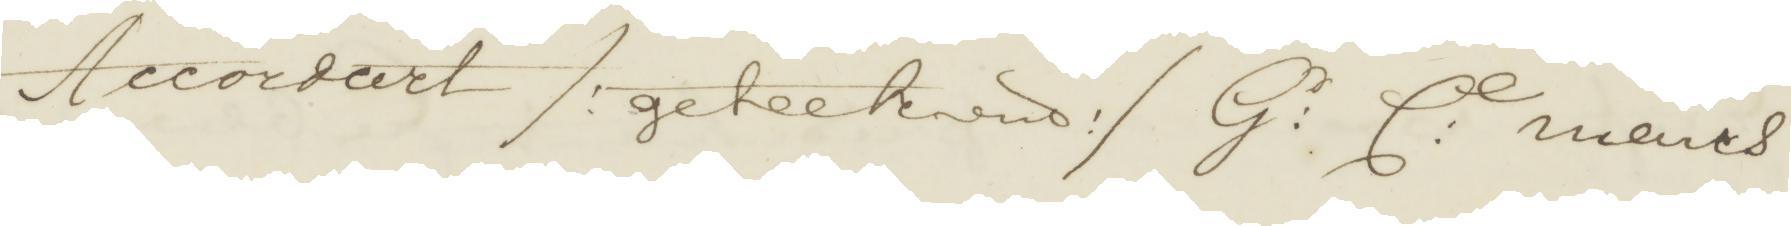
Accordeert /:geteekend:/ G:s C:l meurs
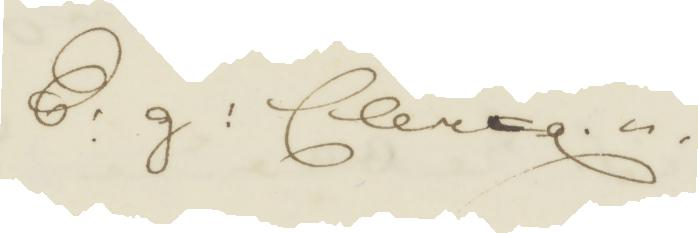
E: g: Clercq.en.~,
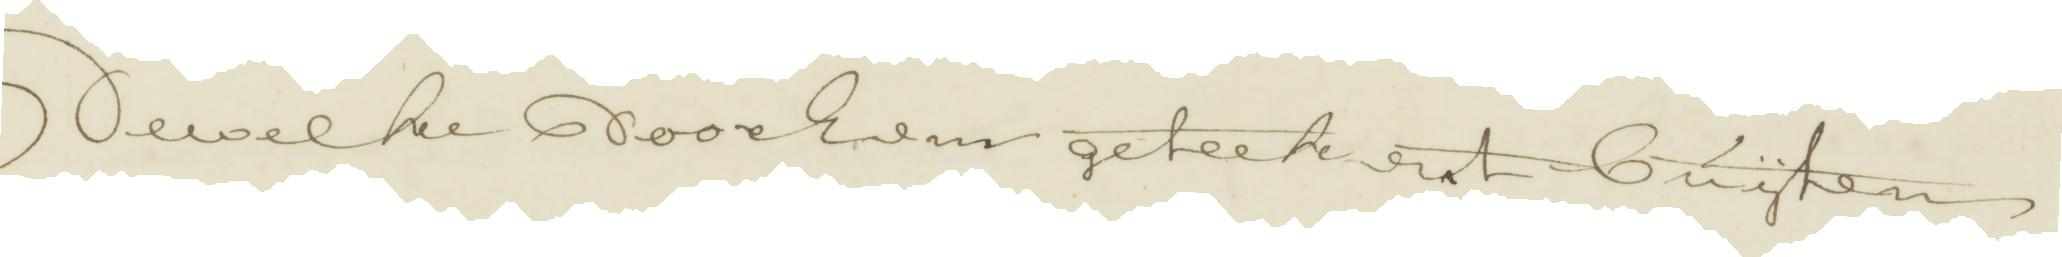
Dewelke door hem geteekent buijten
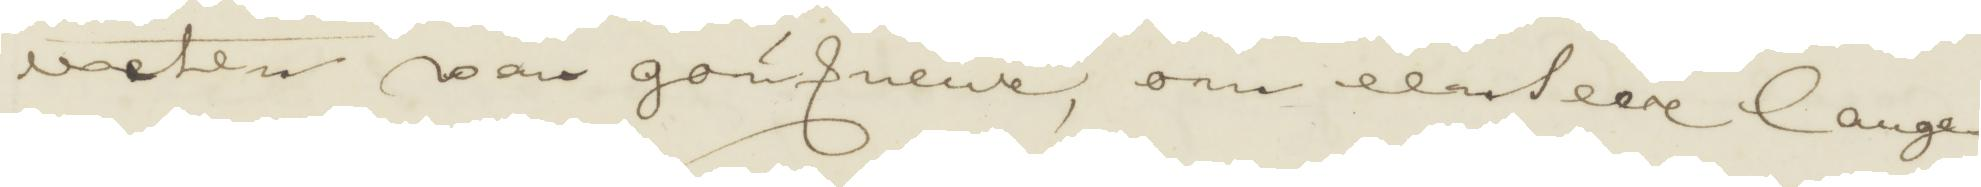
weten van gouverneur, om een seer lange
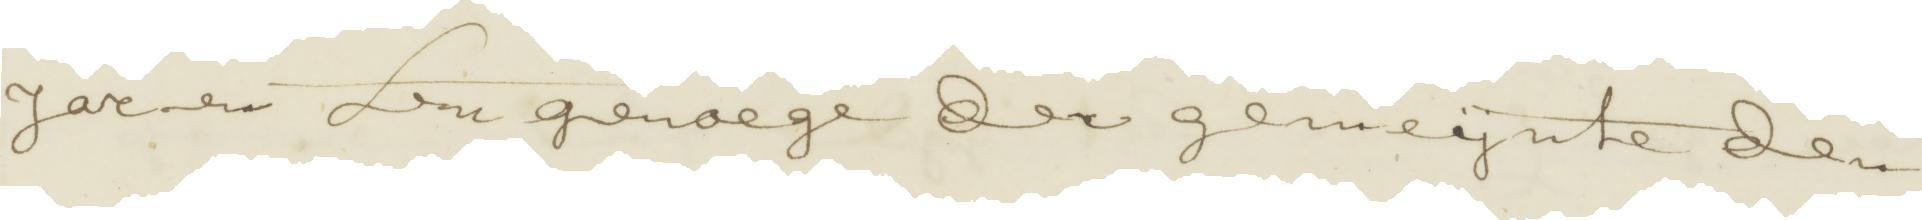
jaren ten genoege der gemeijnte den
